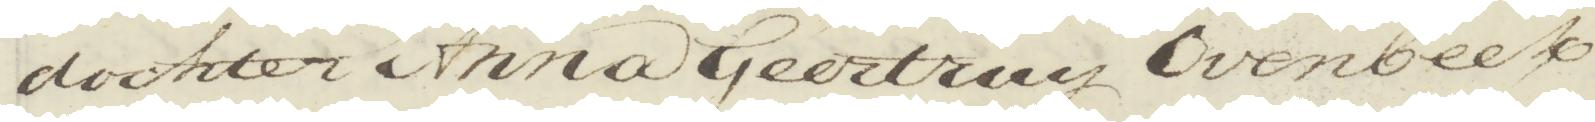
dochter Anna Geertruy Ovenbeek
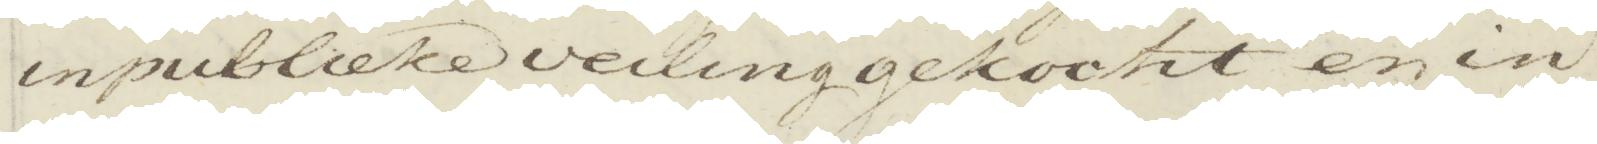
in publieke veiling gekocht en in
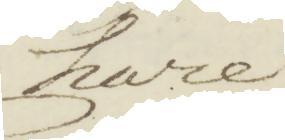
hare
